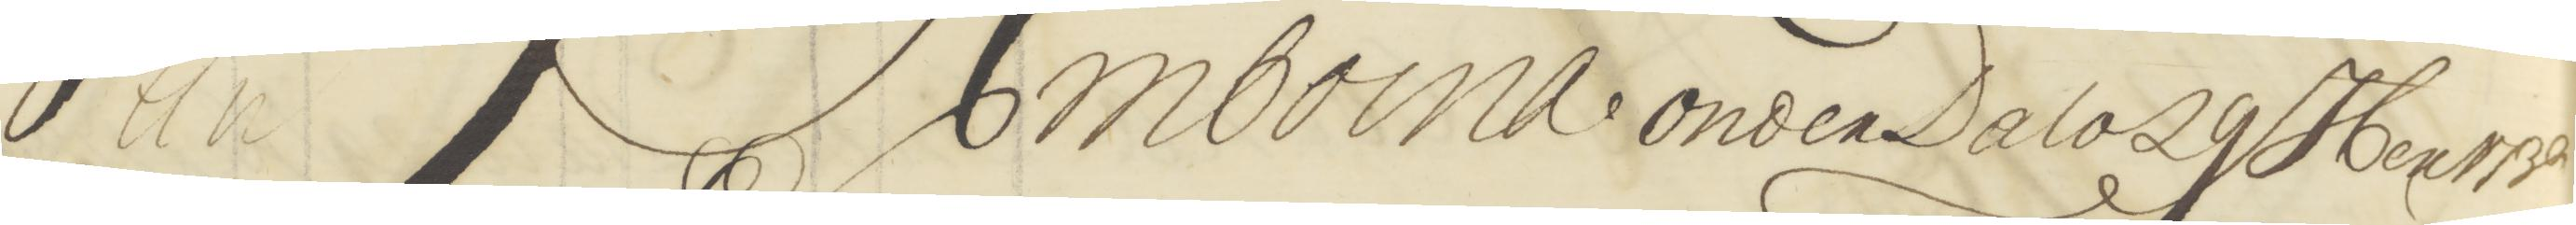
Van Amboina onder Dato 29 7ber 1739
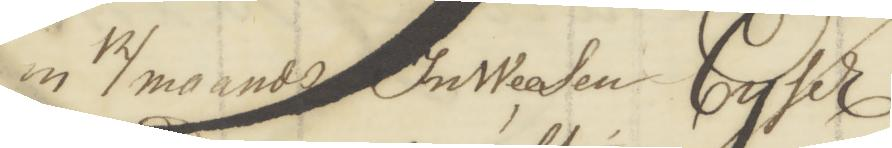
in 12/ maands In Weesen Eysch
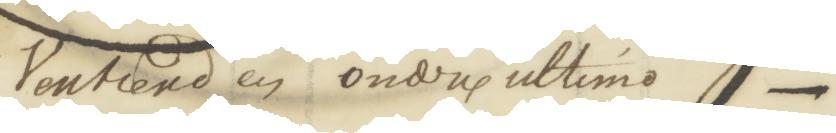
Vertierd en onder ultimo —
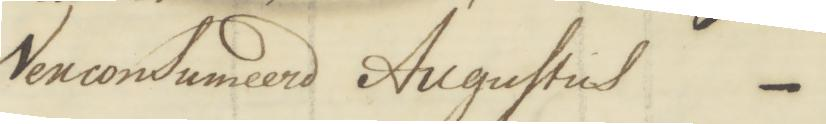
Verconsumeerd Augustus —
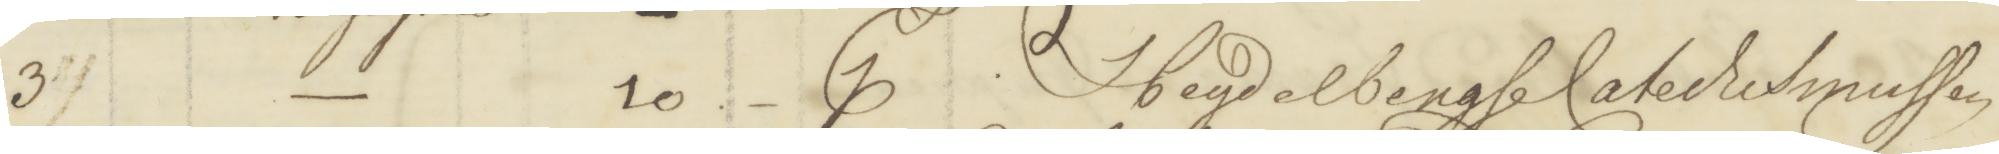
3 — 10 p:s Heydelbergse Catechismussen
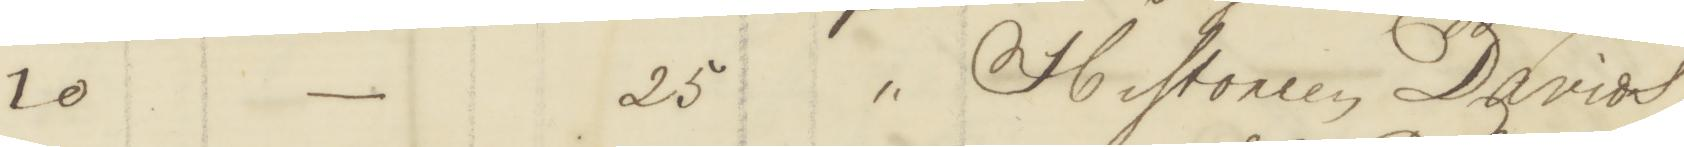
10 — 25 „ Historien Davids
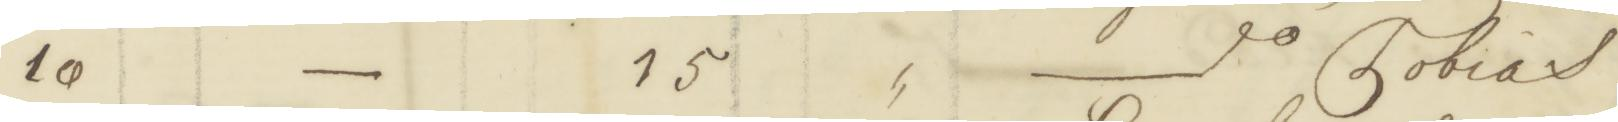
10 — 15 „ _o Tobias
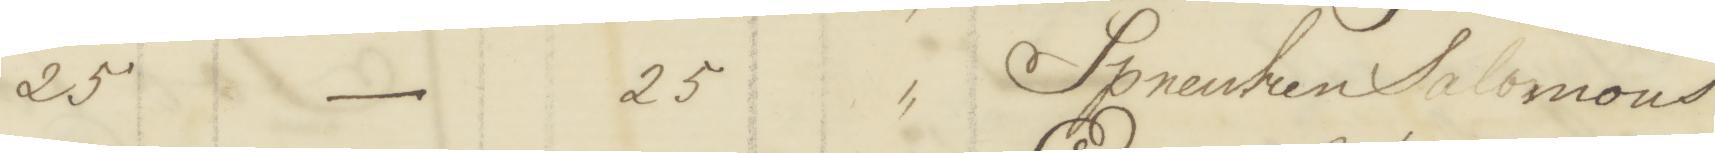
25 — 25 „ Spreuken Salomons
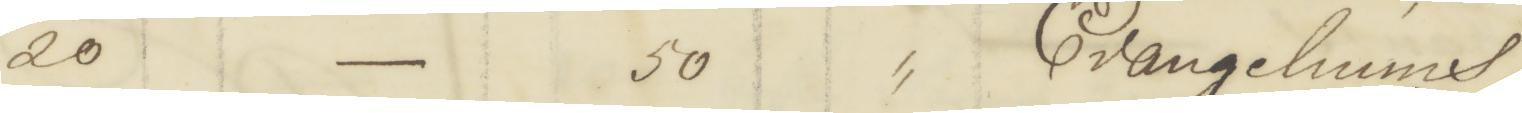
20 — 50 „ Evangeliums
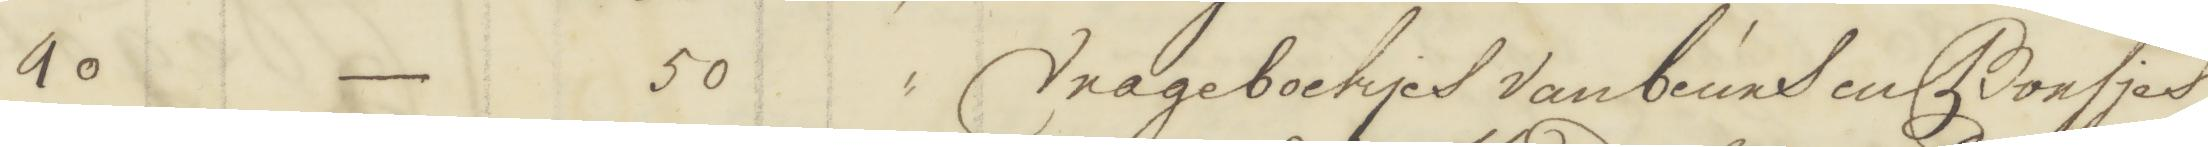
40 — 50 „ Vrageboekjes van beurs en Borsjes
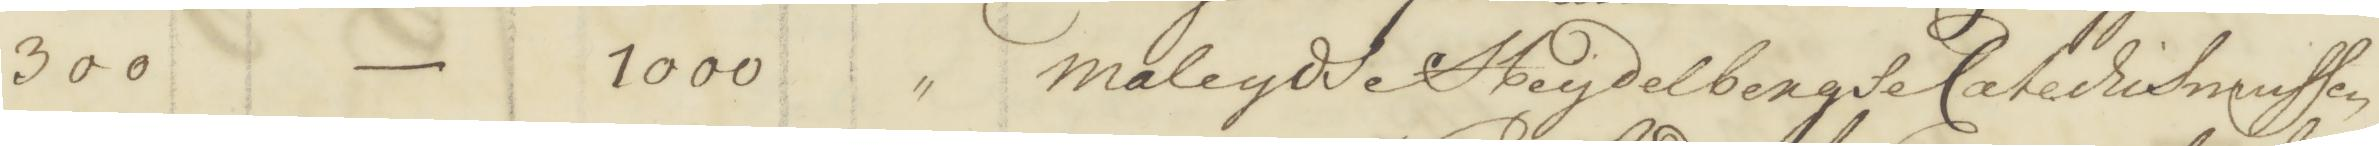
300 — 1000 „ maleydse Heijdelbergse Catechismussen
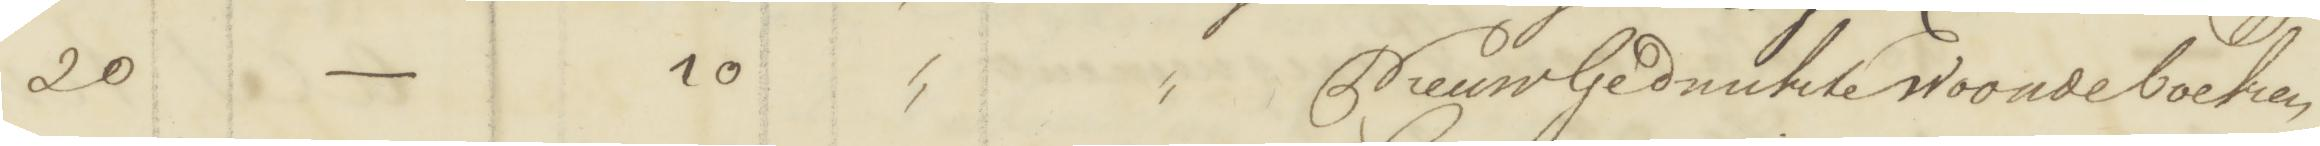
20 — 10 „ „ Nieuw Gedrukte woordeboeken
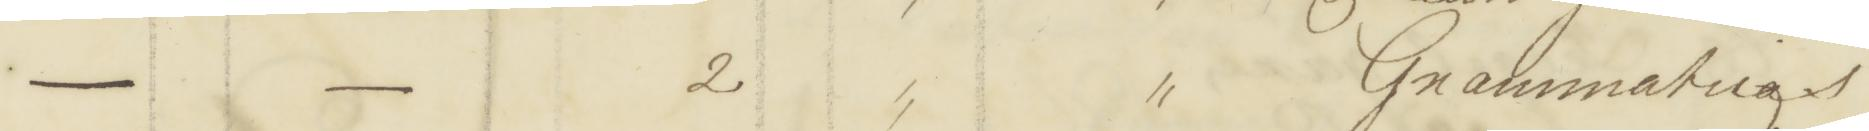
— — 2 „ „ Grammatica's
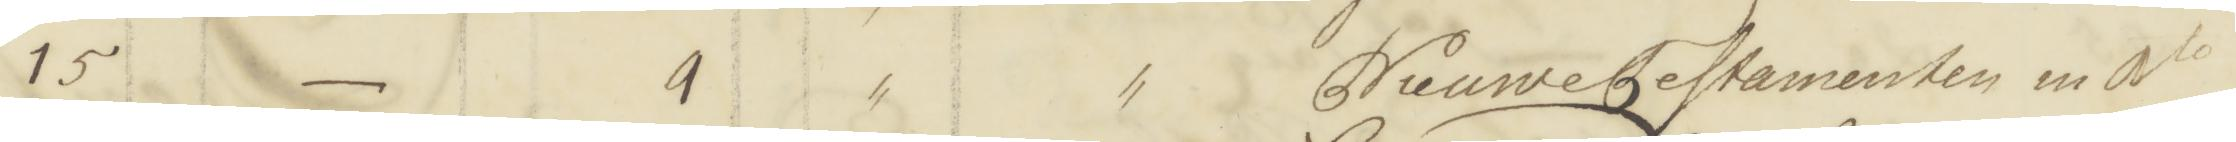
15 — 4 „ „ Nieuwe Testamenten in q:to
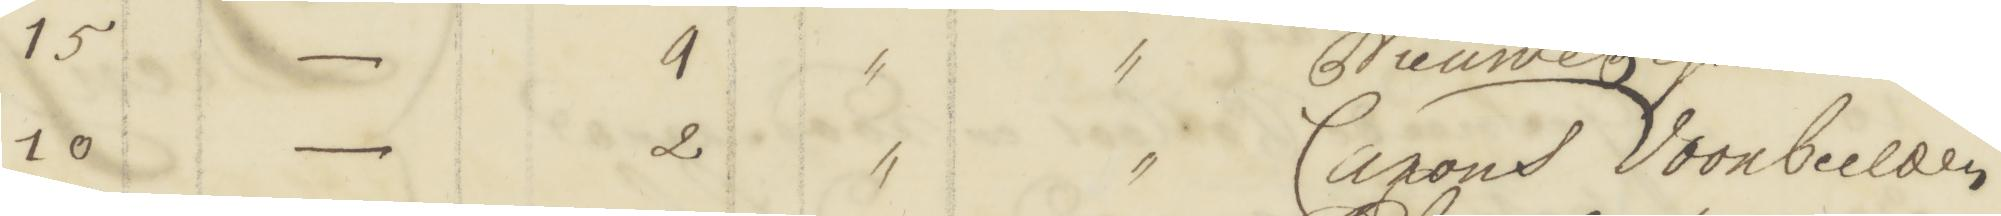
10 — 2 „ „ Carons Voorbeelden
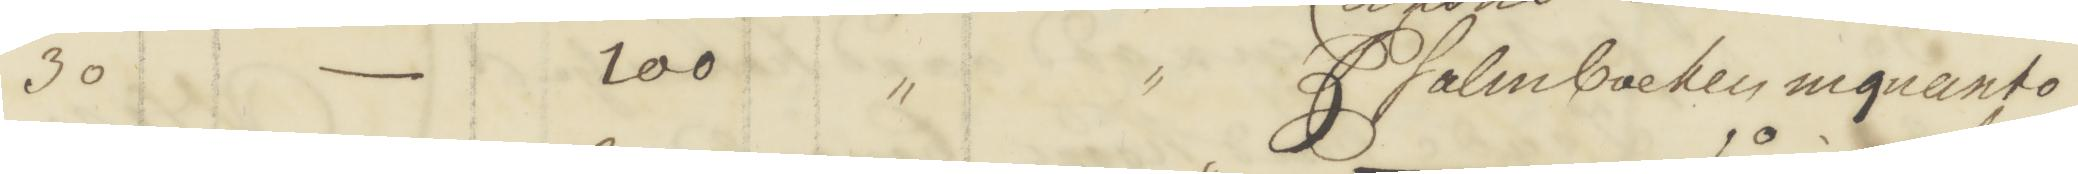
30 — 100 „ „ Psalm boeken in quarto
